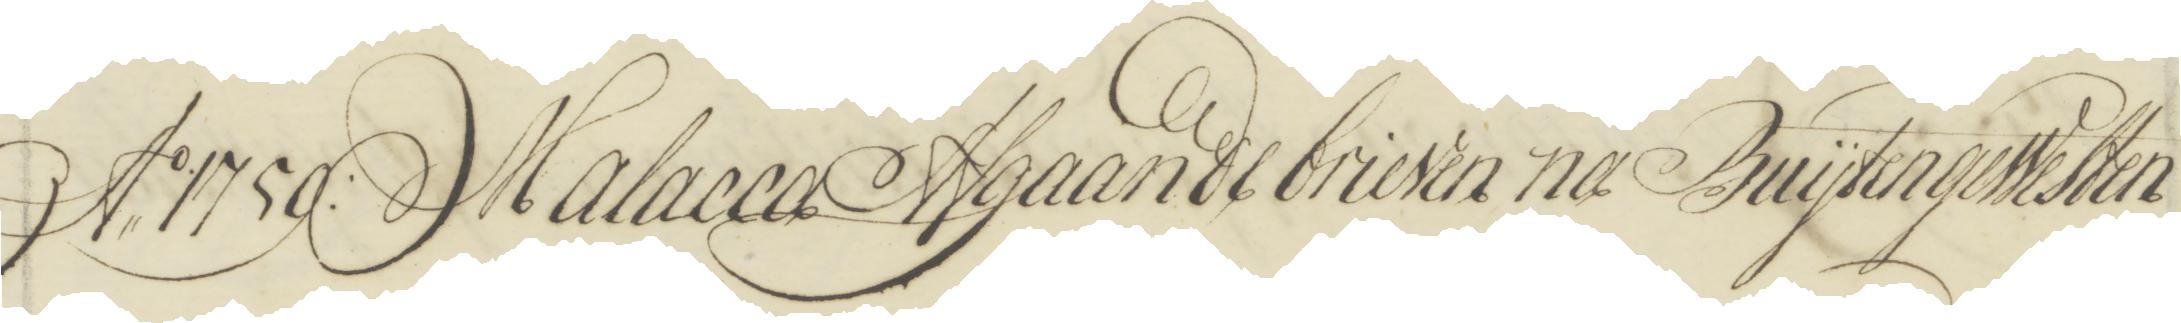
A„o 1759: Malacca Afgaande brieven na Buijtengewesten
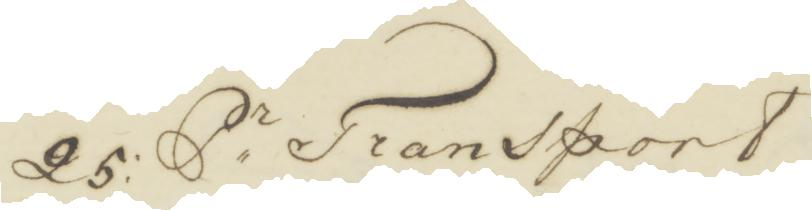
25: P„r Transport
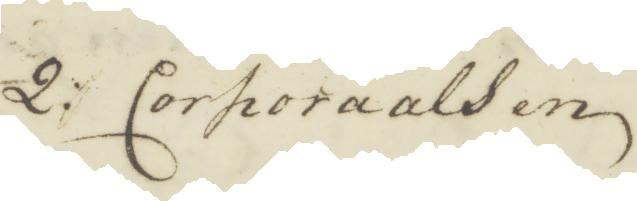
2: Corporaals en
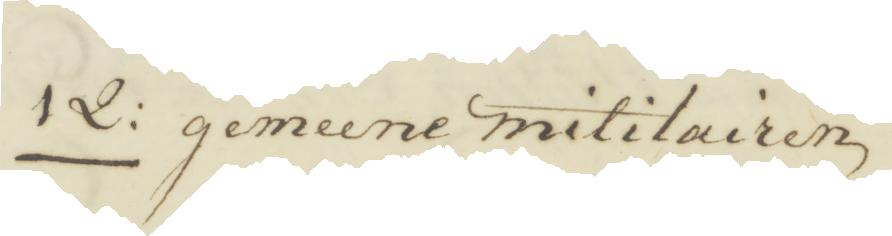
12: gemeene mititairen
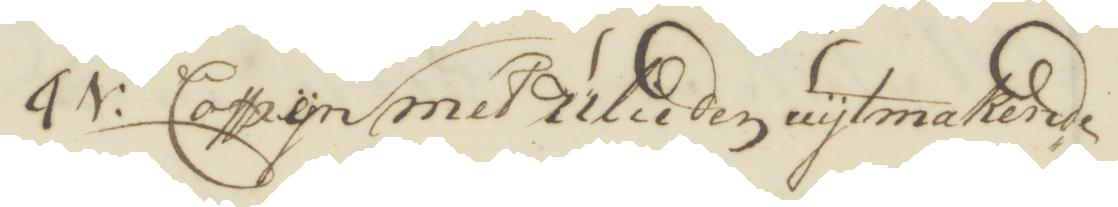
41: Coppijn met ulieden uijtmakende
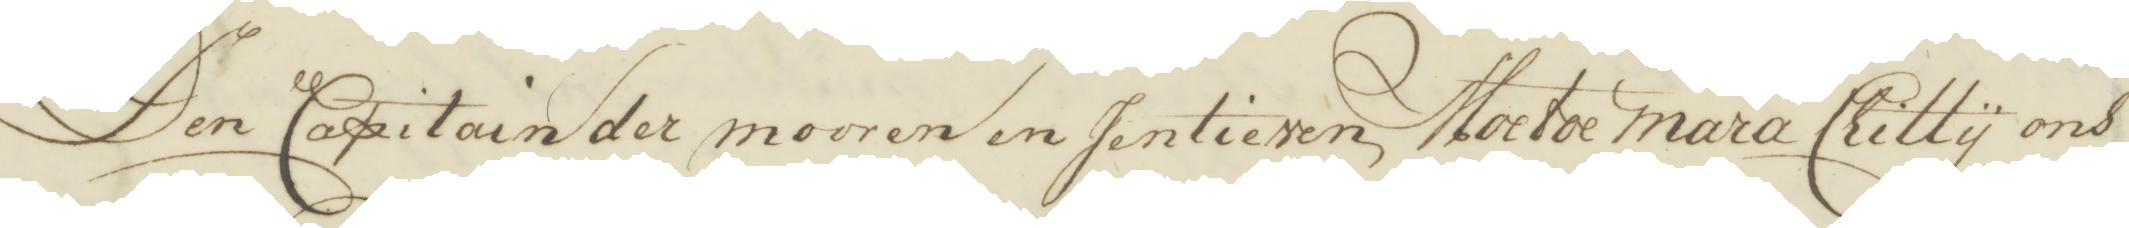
Den Capitain der mooren en Jentieven Moetoe mara Chittij ons
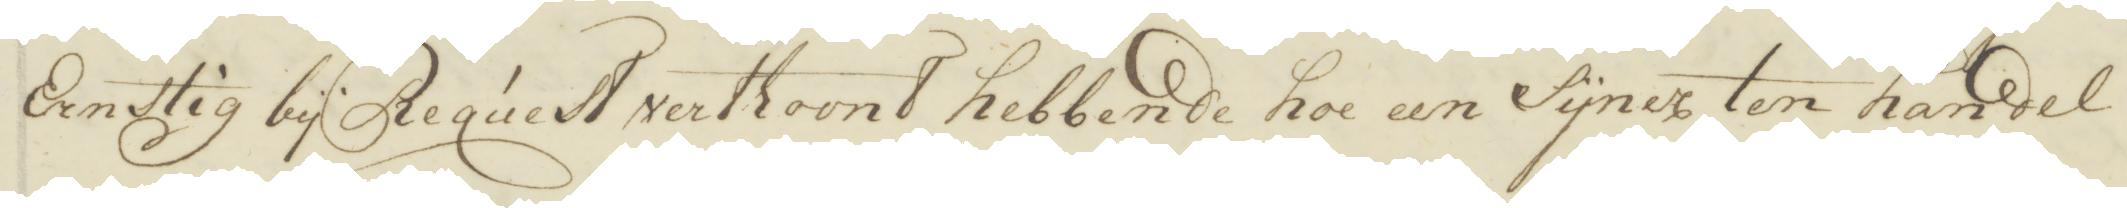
Ernstig bij Request verthoont hebbende hoe een sijner ten handel
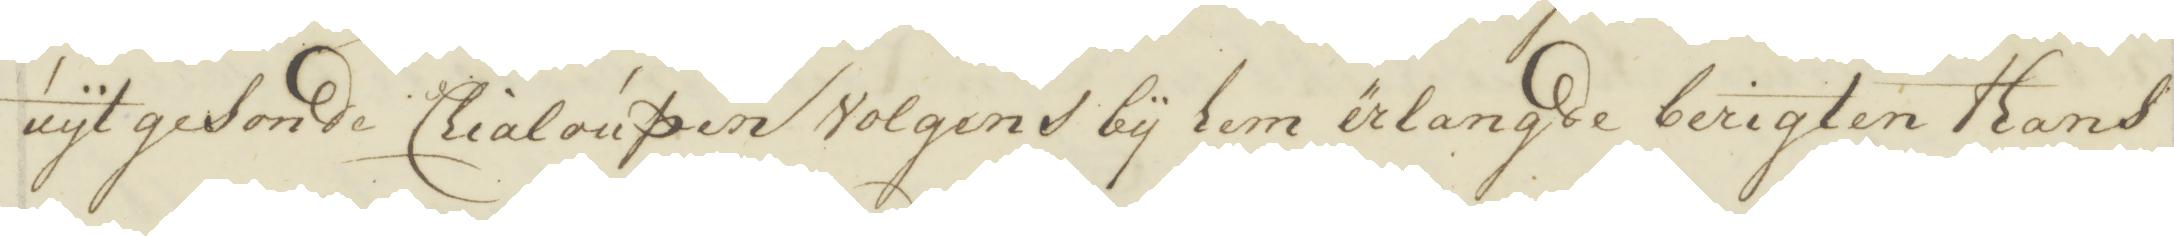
uijt gesonde Chialoupen volgens bij hem ërlangde berigten thans
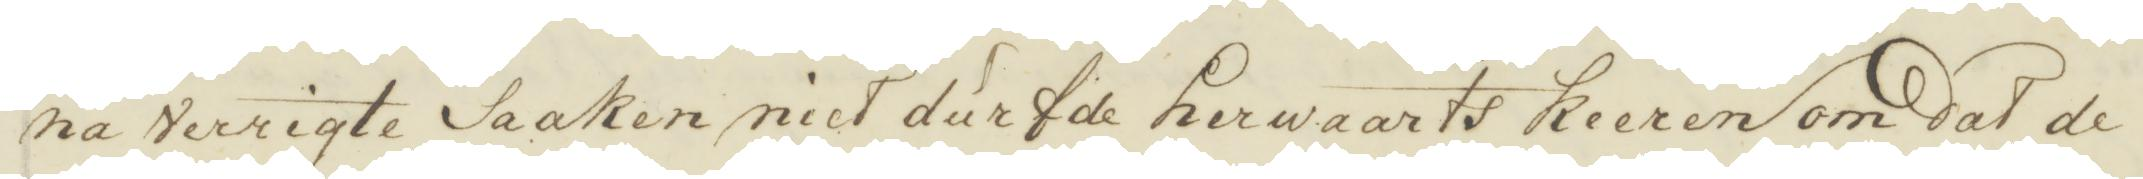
na verrigte saaken niet durfde herwaarts keeren om dat de
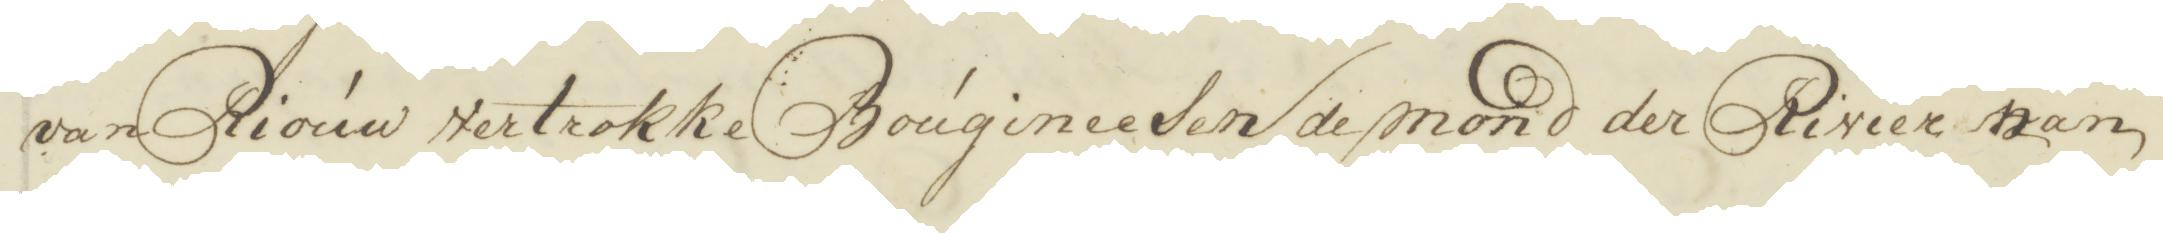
van Riouw vertrokke Bougineesen de mond der Rivier van
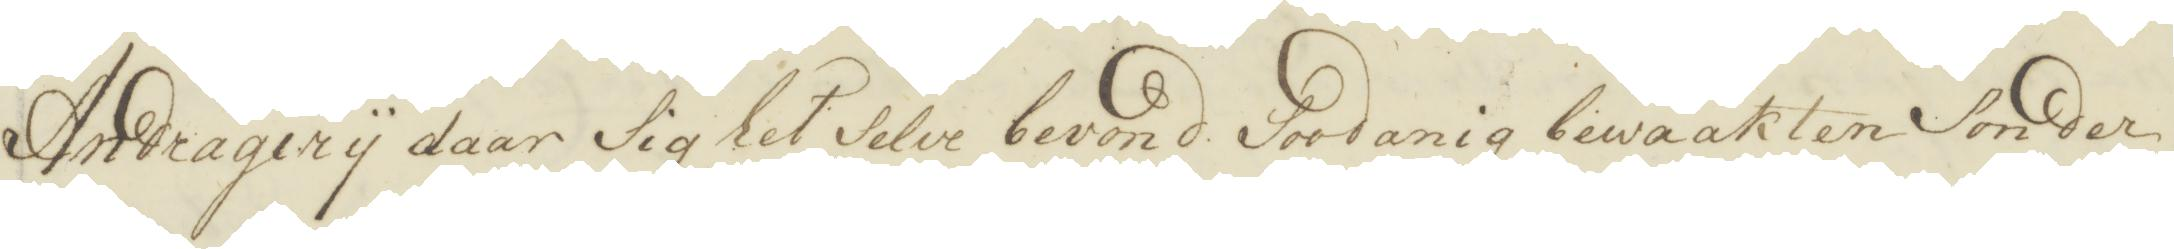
Andragirij daar sig het selve bevond soodanig bewaakten sonder
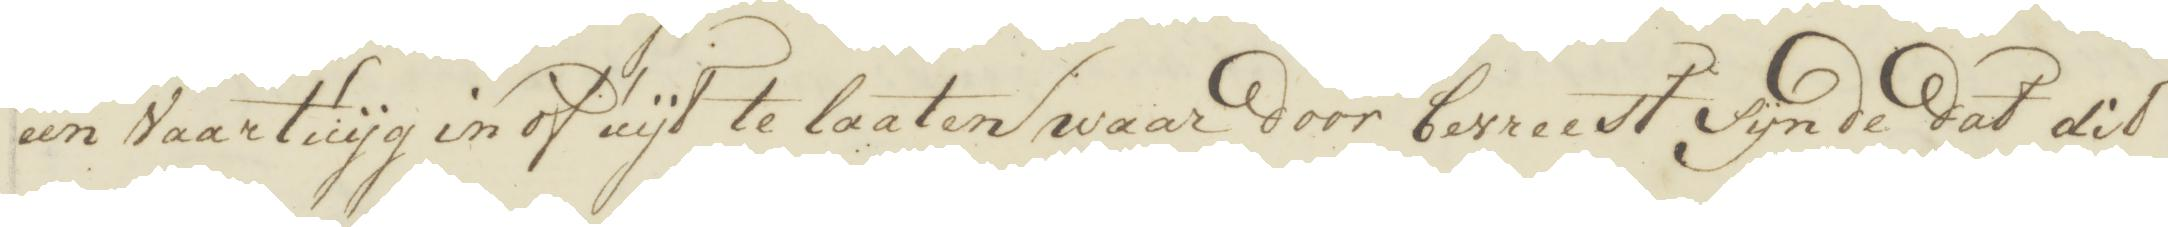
een vaartuijg in of uijt te laaten waar door bevreest sijnde dat dit
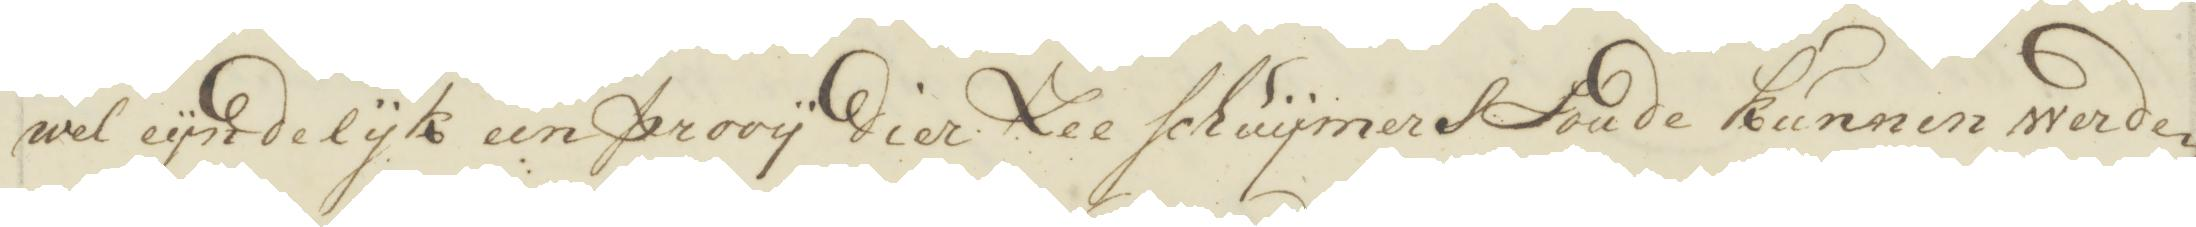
wel eijndelijk een prooij dier Zee schuijmers soude kunnen werden
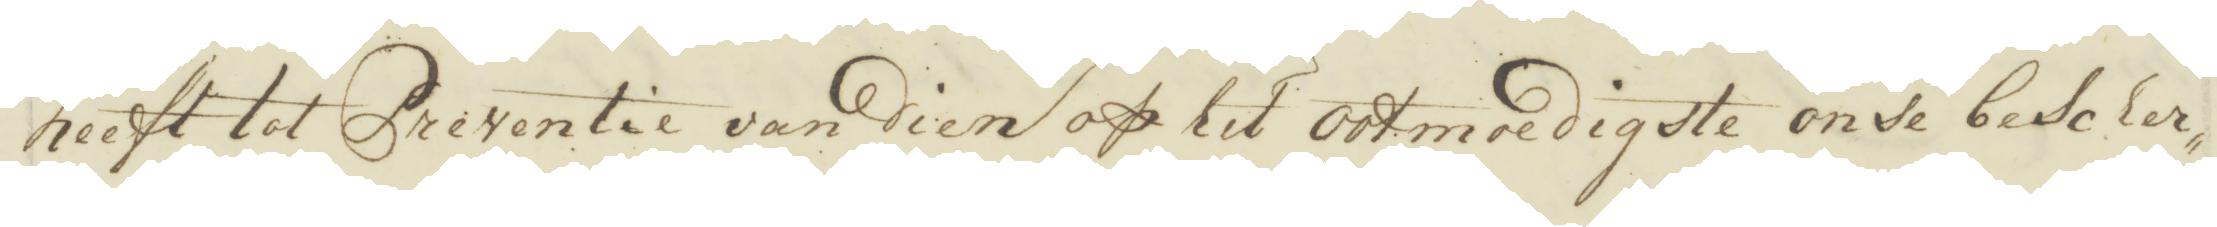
heeft tot Preventie van dien op het ootmoedigste onse bescher„
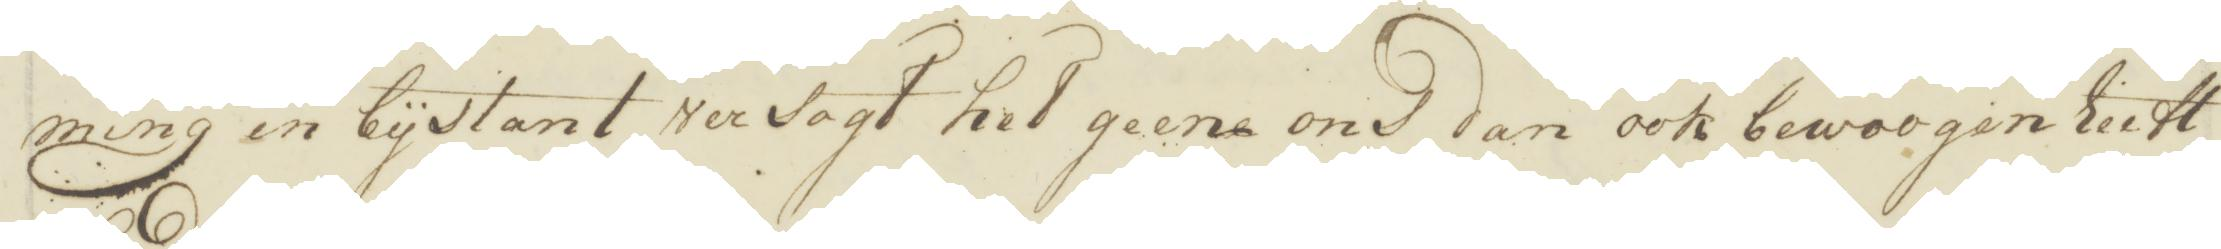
ming in bijstant versogt het geene ons dan ook bewoogen heeft
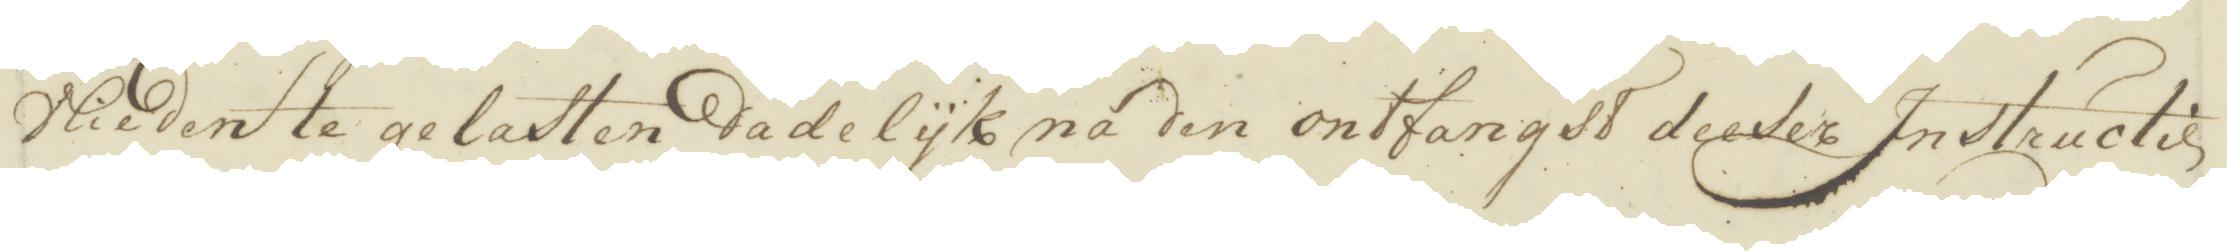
vlieden te gelasten dadelijk na den ontfangst deeser Jnstructien
